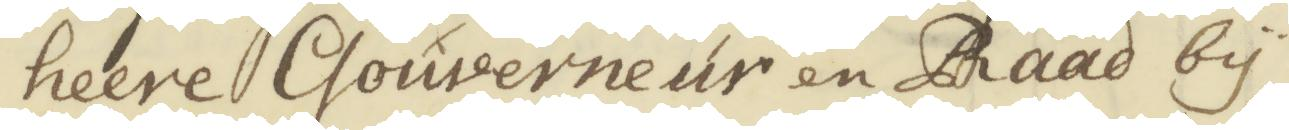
heere Gouverneur en Raad bij
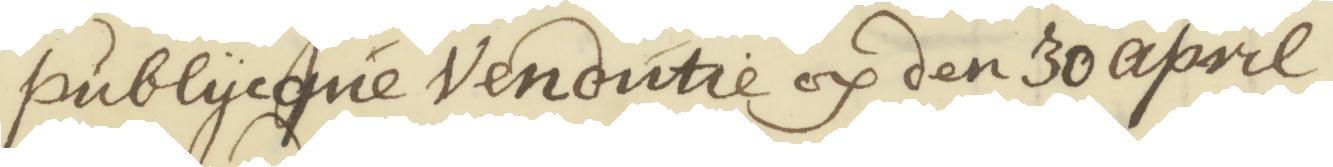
publijcque Vendutie op den 30 april
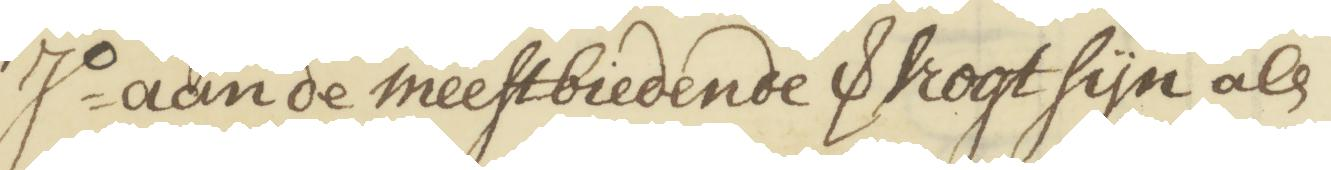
J=o aan de meestbiedende verkogt sijn als
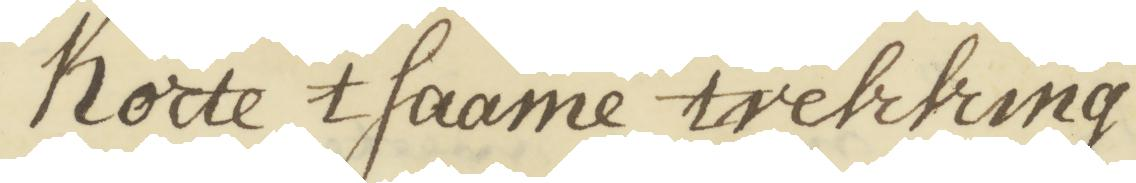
Korte 't saame trekking
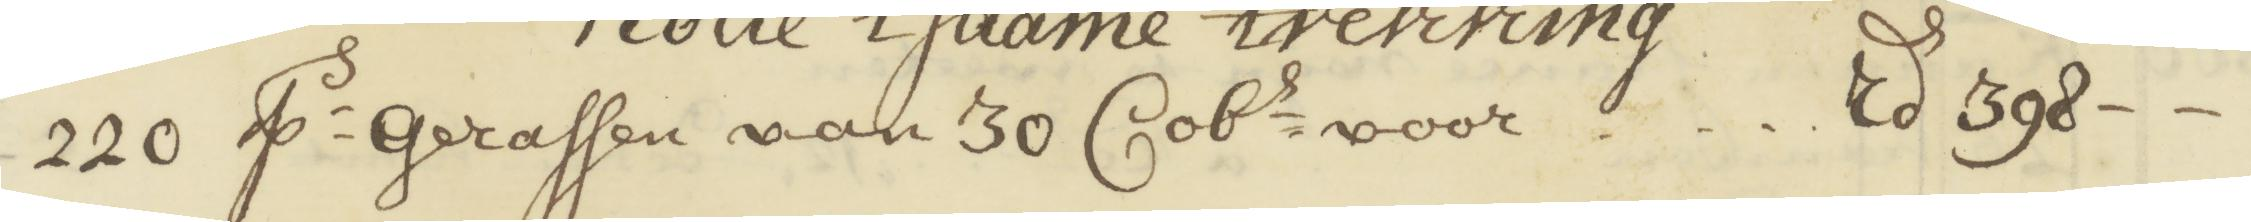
220 p=s gerassen van 30 Cob=s voor . . . . rds 398 - -
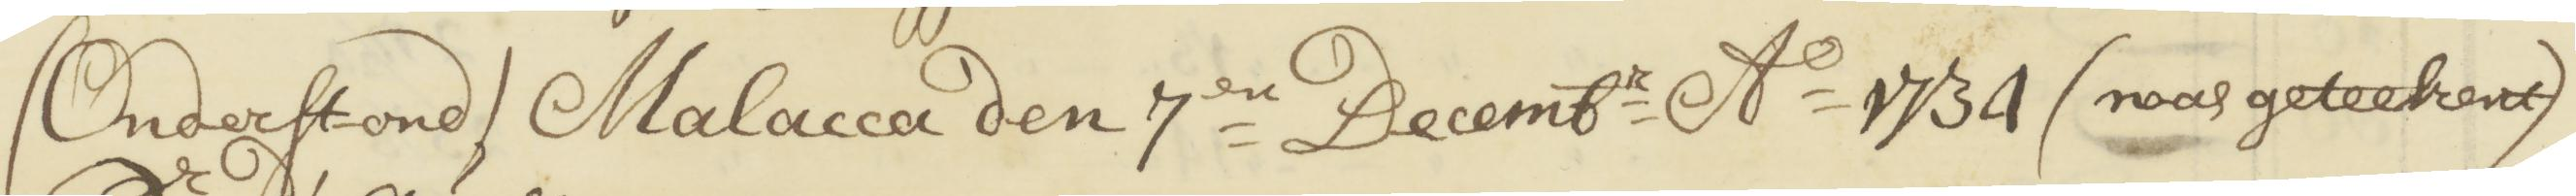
(Onderstond) Malacca den 7=en Decemb=r A=o 1734 (was geteekent)
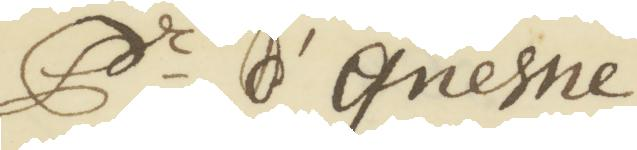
P=r d’ quesne
